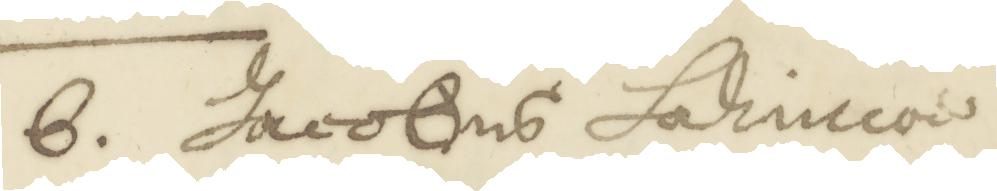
b. Iacobus Sahincoe
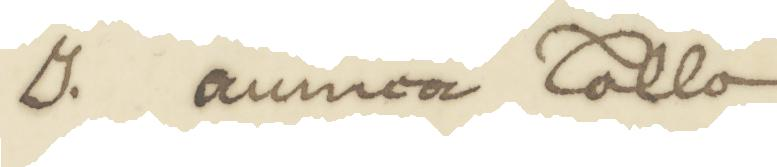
I. annica Tollo
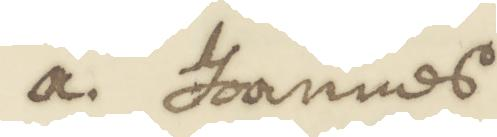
a. Ioannes
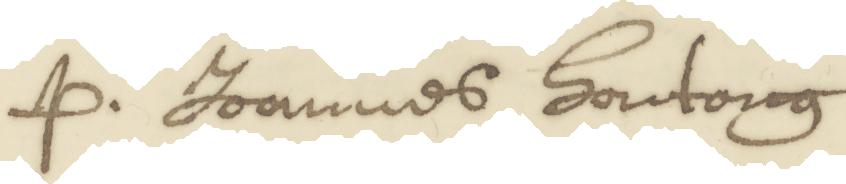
p. Ioannes hartong
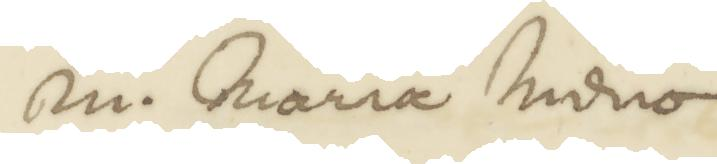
m. Maria Meno
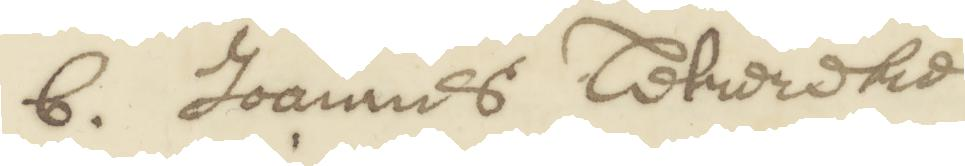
b. Ioannes Tekereke
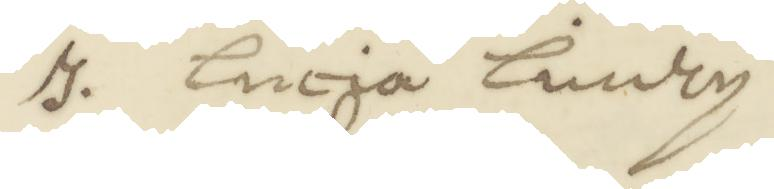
I. Lucia Luurij
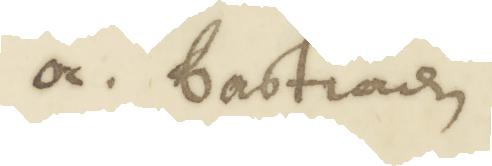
a. bastiaen
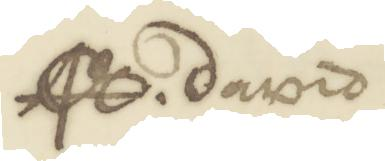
pr. david
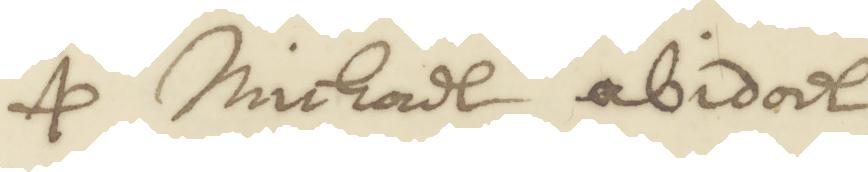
p Michael abidoel
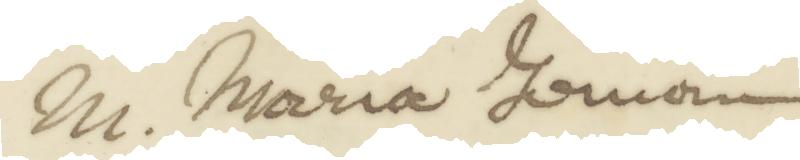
M. Maria Ieman
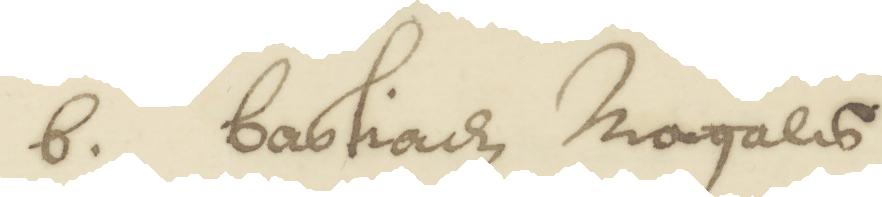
b. bastiaen Magalis
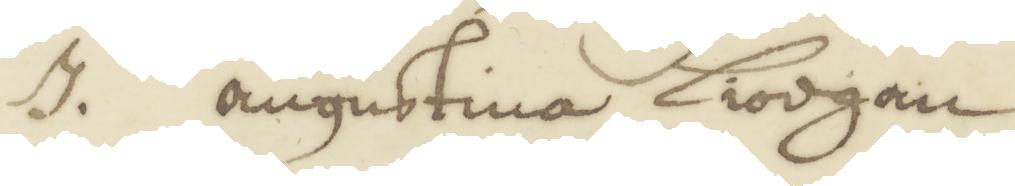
I. augustina Lioegan
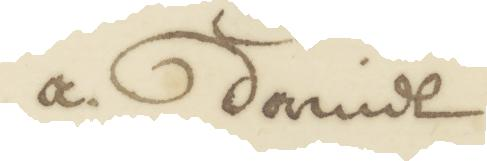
a. daniel
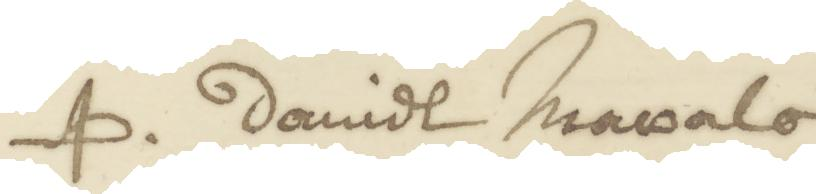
p. daniel mawalo
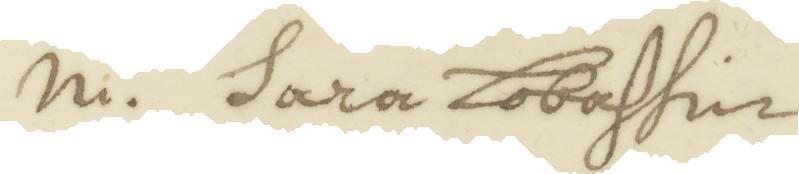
m. Sara Lobassin
